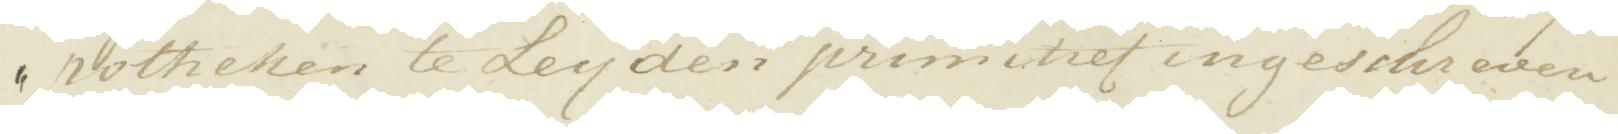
„potheken te Leijden primitief ingeschreven
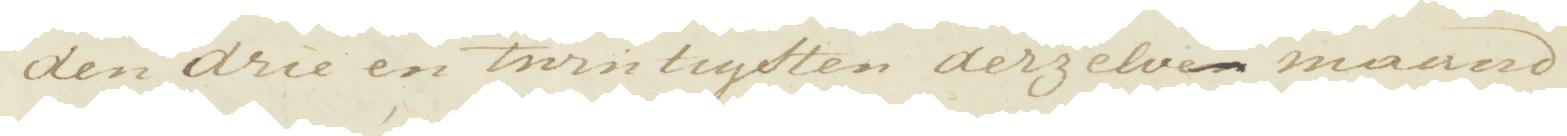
den drie en twintigsten derzelven maand
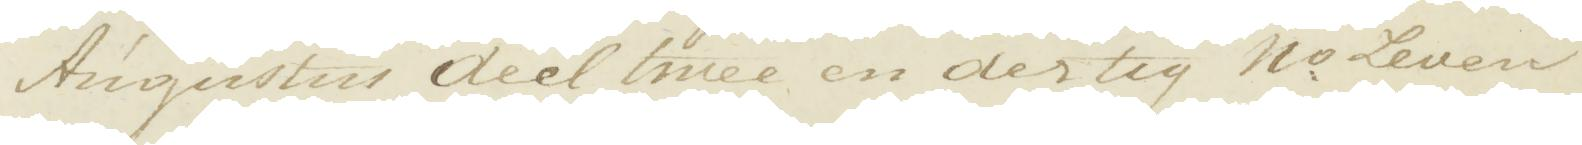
Augustus deel twee en dertig N:o zeven
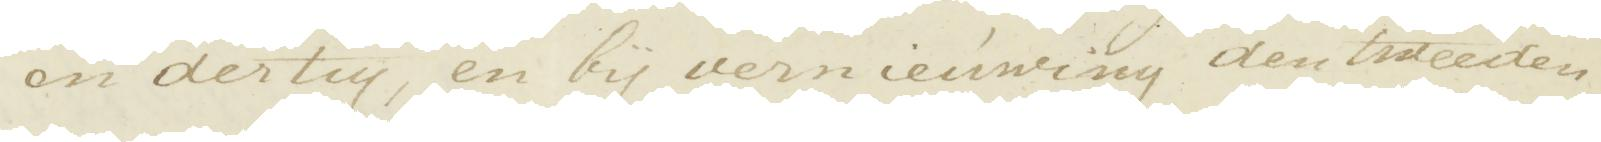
en dertig, en bij vernieuwing den tweeden
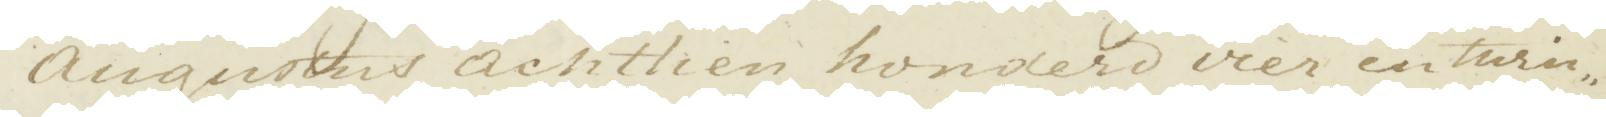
augustus achttien honderd vier en twin„
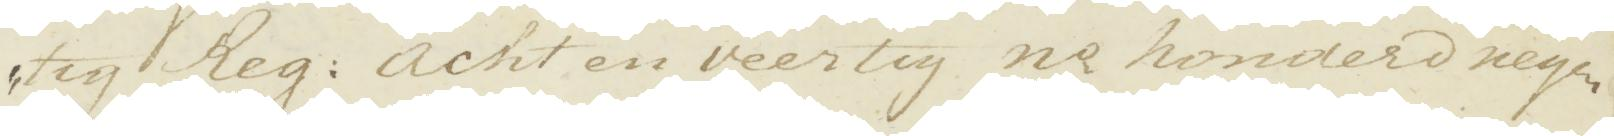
„tig Reg: acht en veertig n:o honderd negen
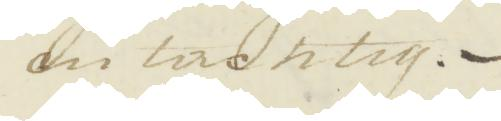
en tachtig.
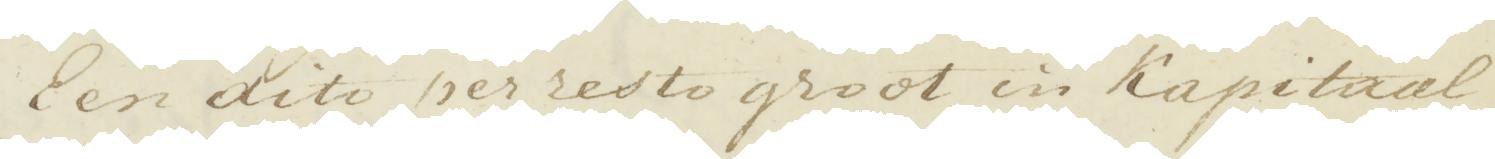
Een dito per resto groot in Kapitaal
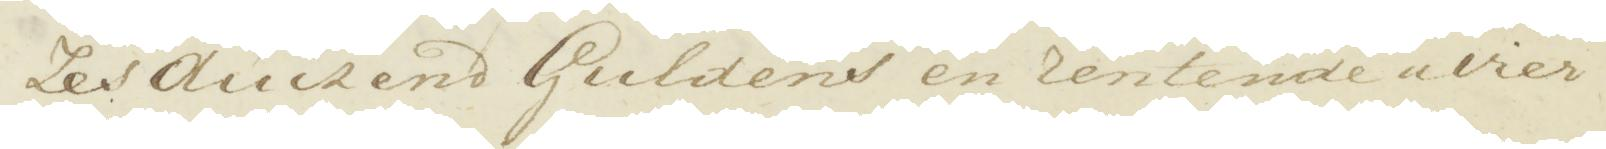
zes duizend Guldens en rentende a vier
